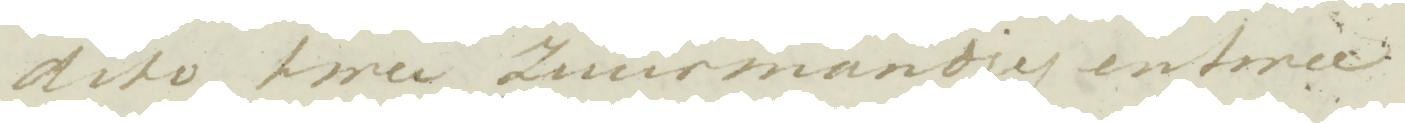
dito, twee zuurmandjes en twee
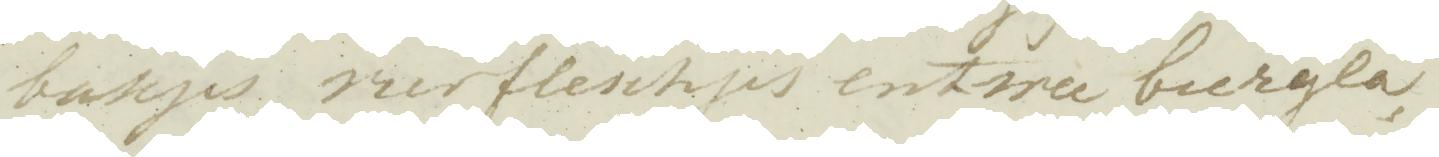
bakjes, vier fleschjes entwee biergla„
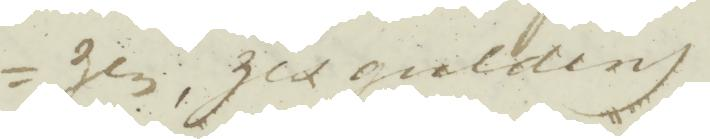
= zen, zes guldens
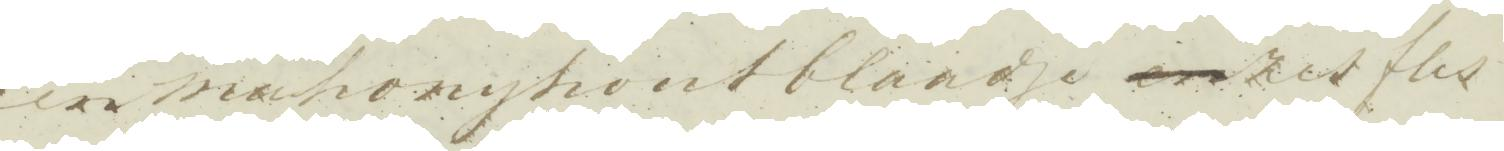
Een mahonyhout blaadje en zes fles
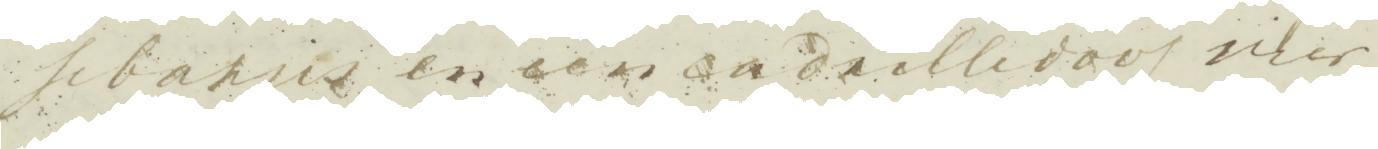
sebakjes, en een cadrilledoos vier
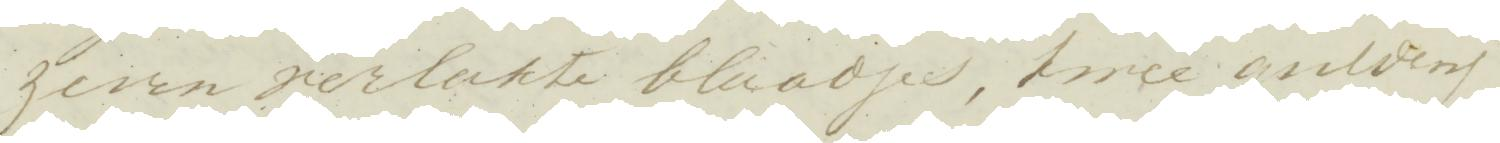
Zeven verlakte blaadjes, twee guldens
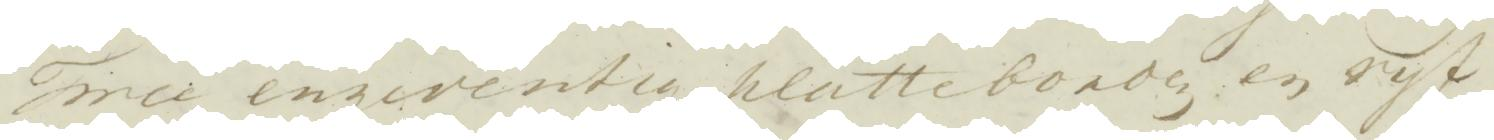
Twee enzeventig platteborden en vyf
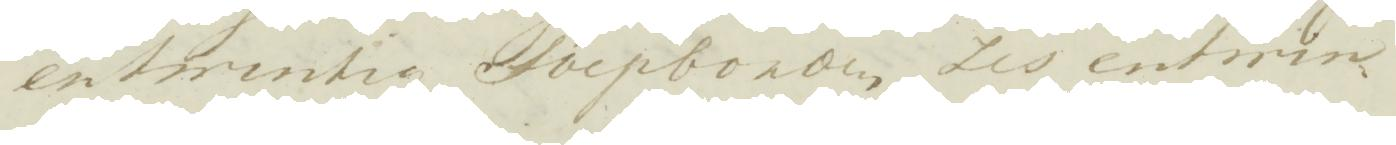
en twintig soepborden, zes entwin„
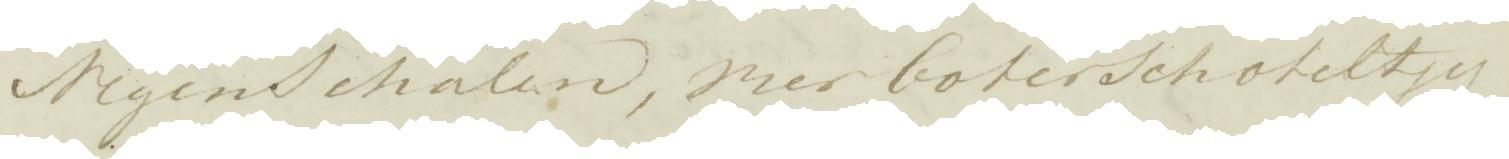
Negenschalen, vier boterschoteltjes
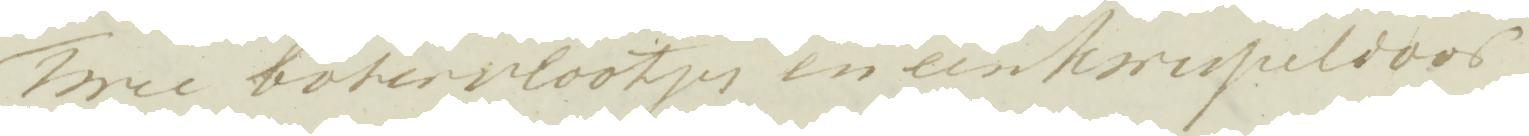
Twee botervlootjes en een kwispeldoor
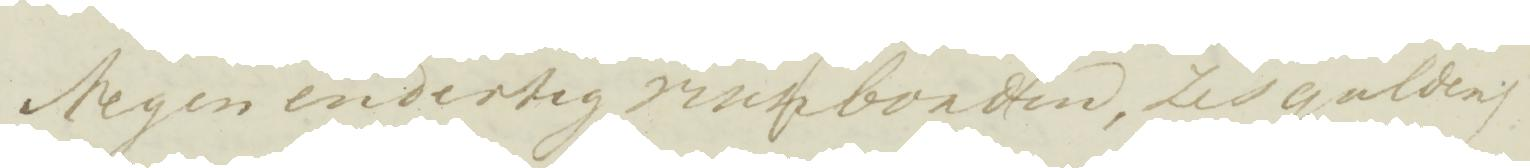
Negen endertig vischborden, zes guldens
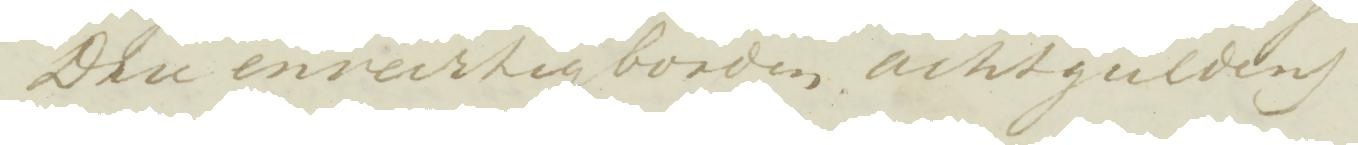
Drie enveertig borden acht guldens
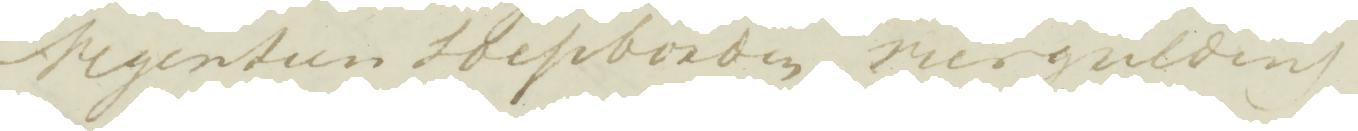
Negentien soepborden, vier guldens
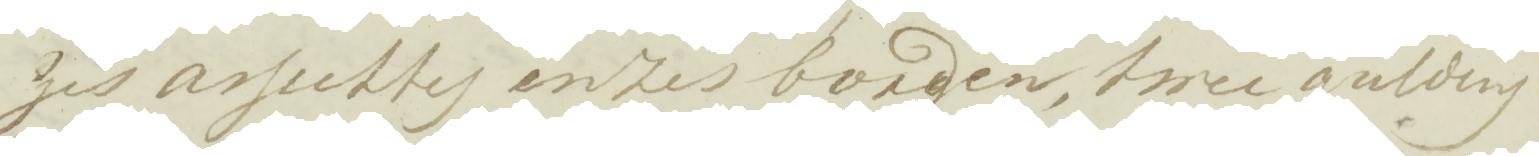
Zes assiettes enzes borden, twee guldens
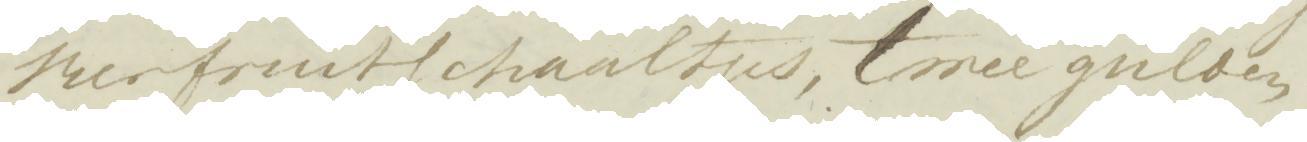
vier fruitschaaltjes, twee gulden
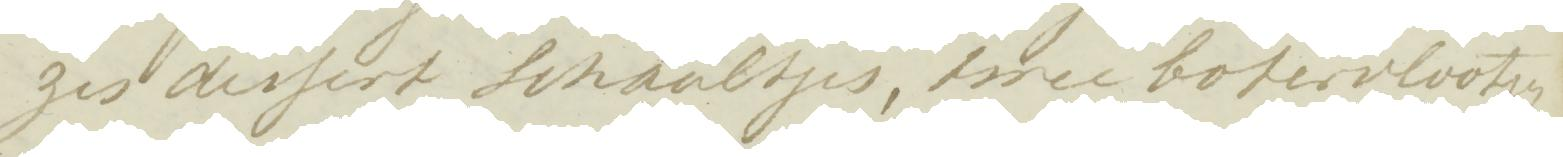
zes dessert schaaltjes, twee botervlootjes
